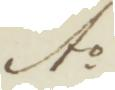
A_o
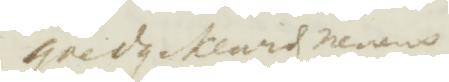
Goedgekeurd nevens
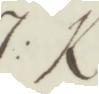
I:K:
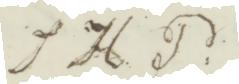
IH.P:
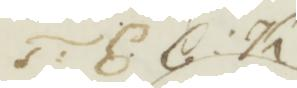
T:E.C:K.
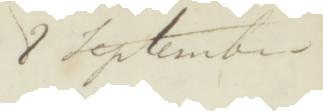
8 september
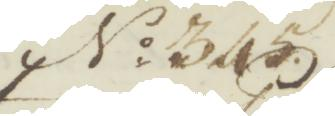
N=o 345.
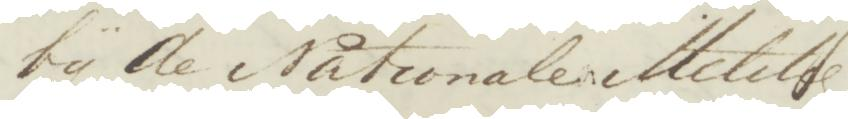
bij de Nationale Militie
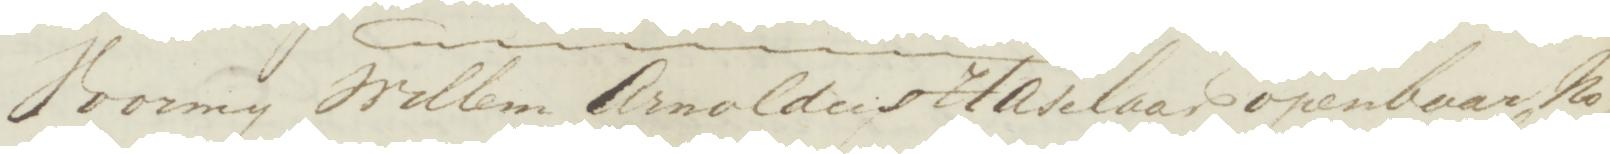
Voor my Willem Arnoldus Haselaar openbaar No
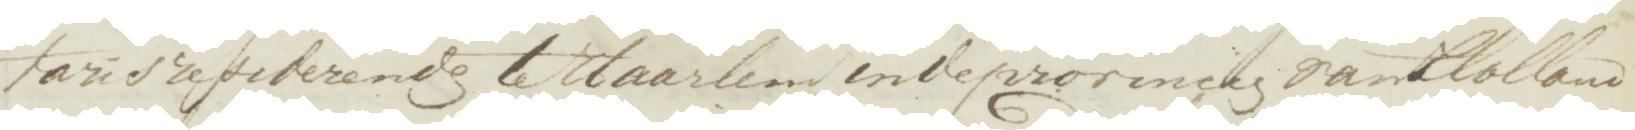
taris residerende te Haarlem in de provincie van Holland
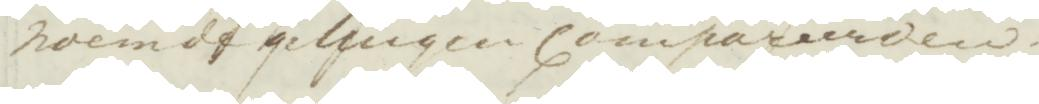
noemde getuigen Compareerden.
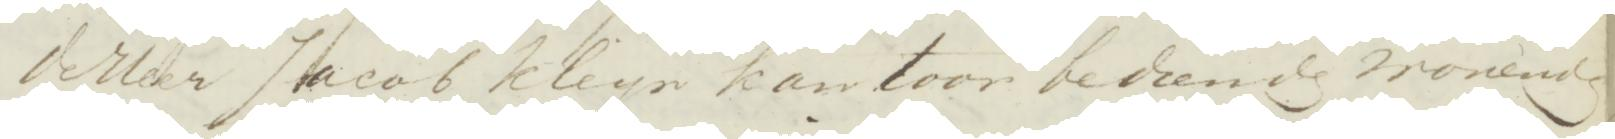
de Heer Jacob Kleyn kantoor bediende wonende
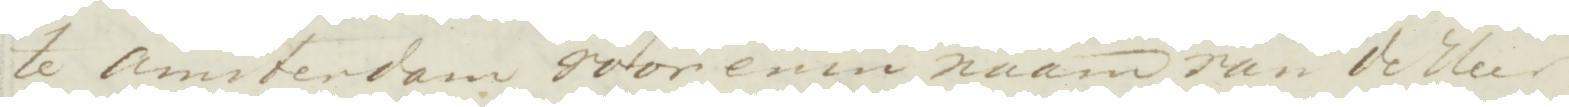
te Amsterdam voor en in naam van de Heer
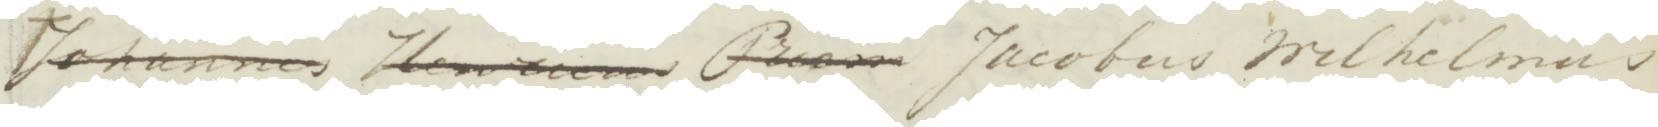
Johannes Henricus Priem Jacobus Wilhelmus
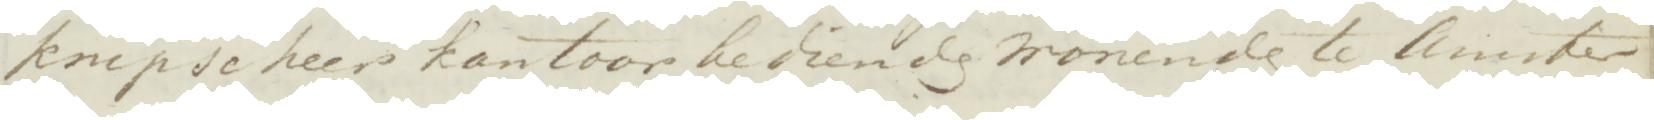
knipscheer kantoorbediende wonende te Amster
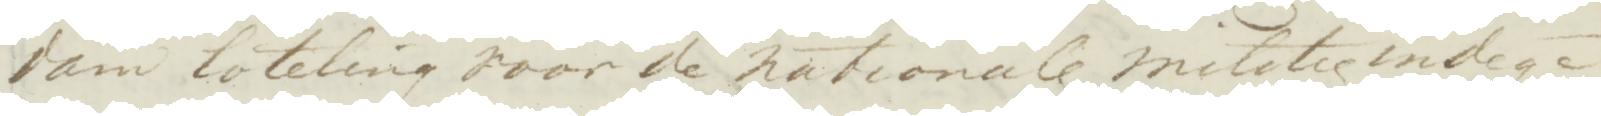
dam loteling voor de nationale militie in de ge
